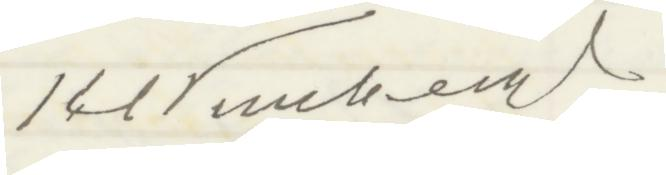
H Tombergh
